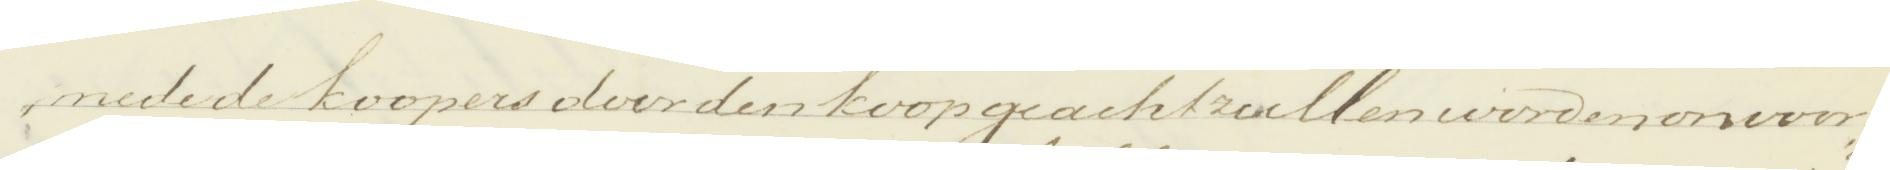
„mede de koopers door den koop geacht zullen worden onvoor„
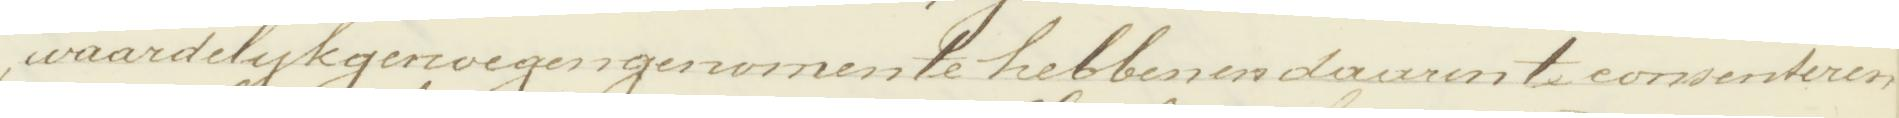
„waardelyk genoegen genomen te hebben en daarin te consenteren
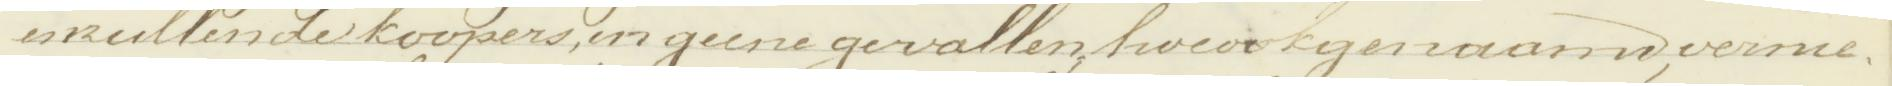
en zullen de koopers, in geene gevallen, hoe ook genaamd vernie„
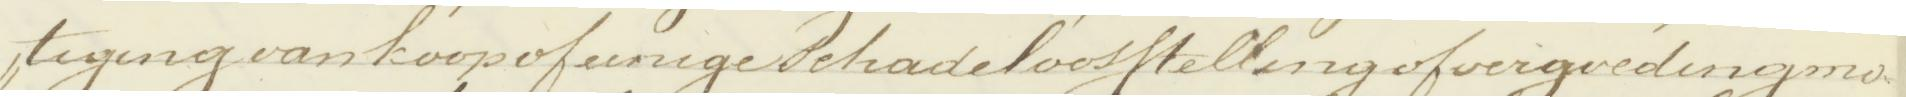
„tiging van koop of eenige schadeloosstelling of vergoeding mo„
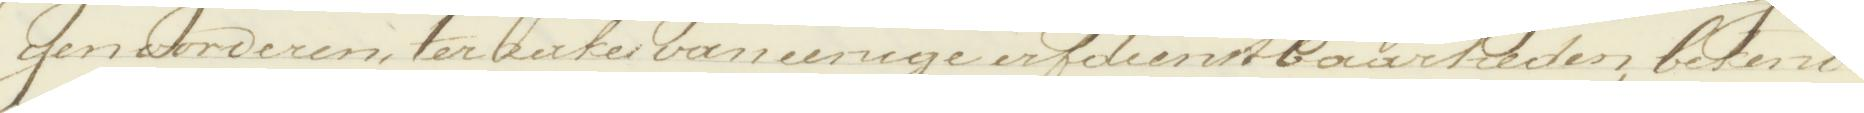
gen vorderen, ter zake van eenige erfdienstbaarheden, bekend
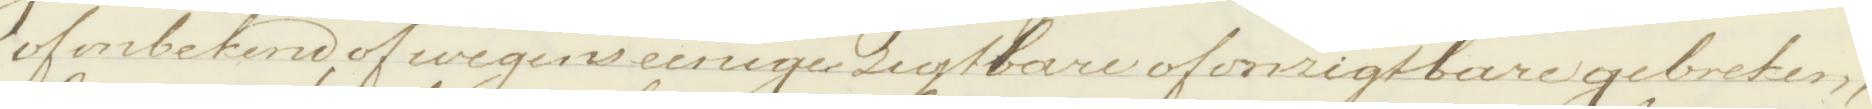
of onbekend, of wegens eenige zigtbare of onzigtbare gebreken,
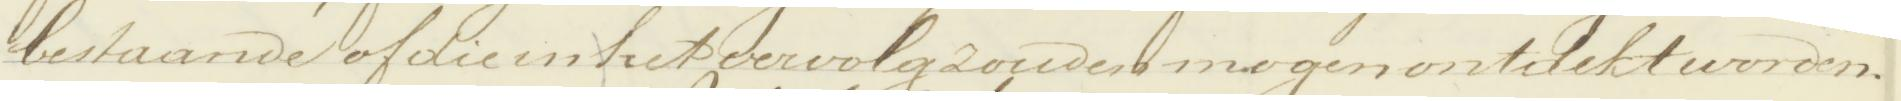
bestaande of die in het vervolg zouden mogen ontdekt worden.
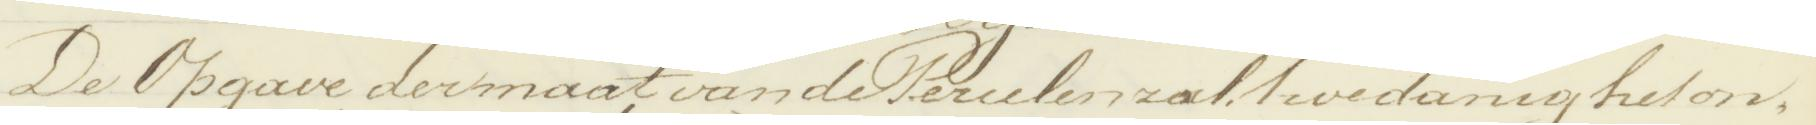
De Opgave der maat van de Percelen zal hoedanig het on„
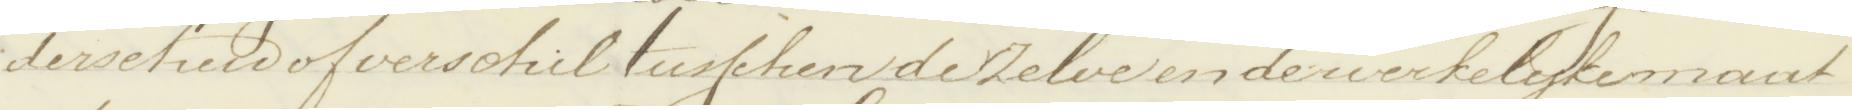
derscheid of verschil tusschen de Zelve en de werkelyke maat
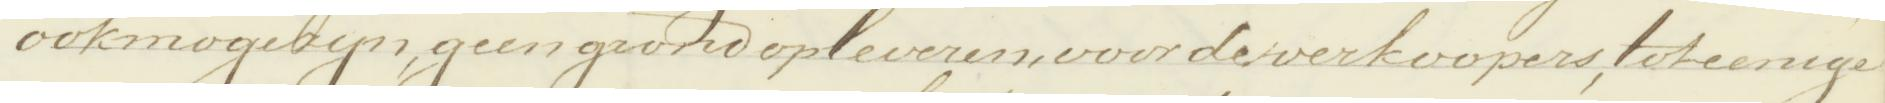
ook moge zyn geen grond opleveren, voor de verkoopers, tot eenige
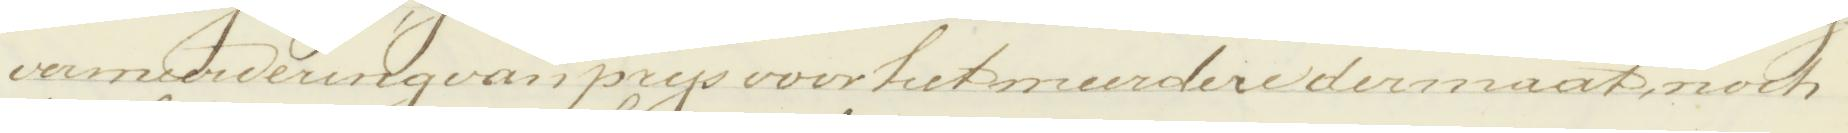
vermeerdering van prys voor het meerdere der maat, noch
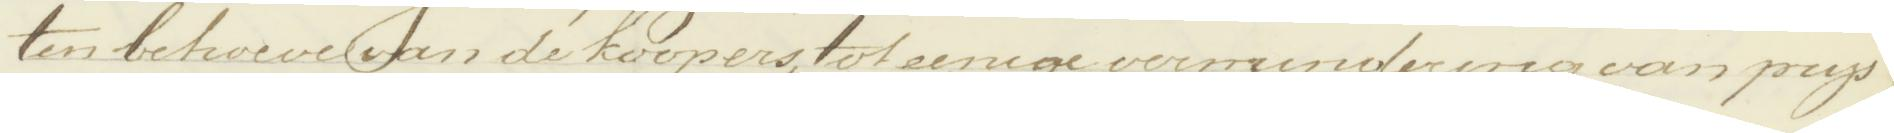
ten behoeve van de koopers, tot eenige vermindering van prys
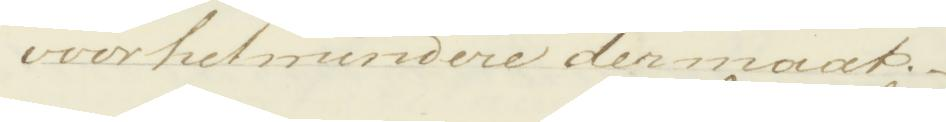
voor het mindere dermaat.-
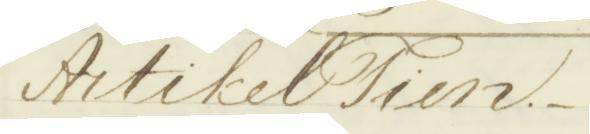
Artikel Tien.-
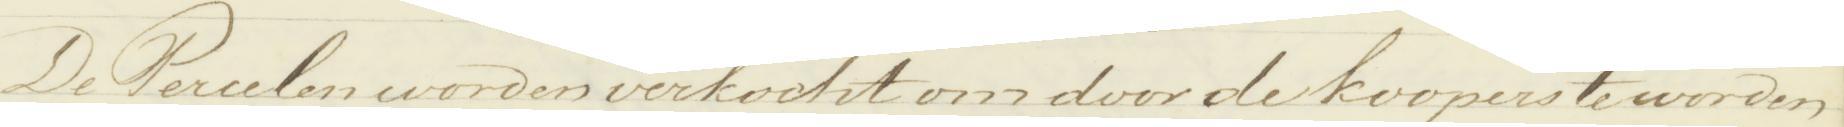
De Percelen worden verkocht om door de koopers te worden
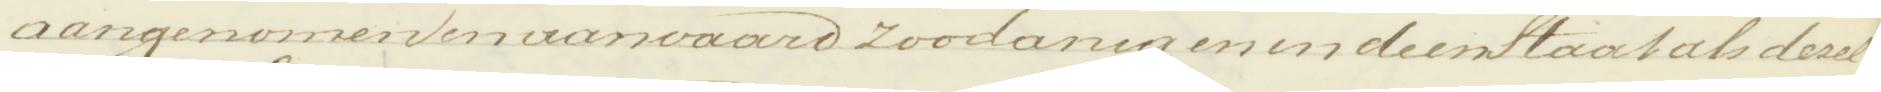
aangenomen en aanvaard zoodanig en in dien staat als dezel
